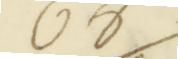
68 /:
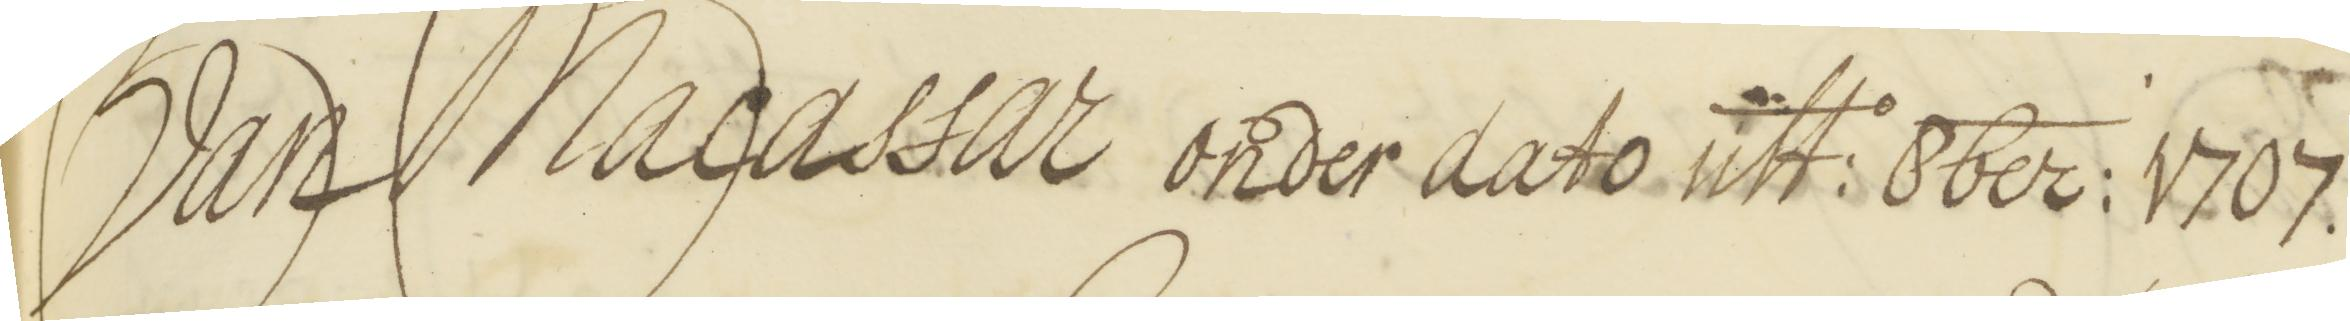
Van Macassar onder dato ult:o 8ber: 1707.
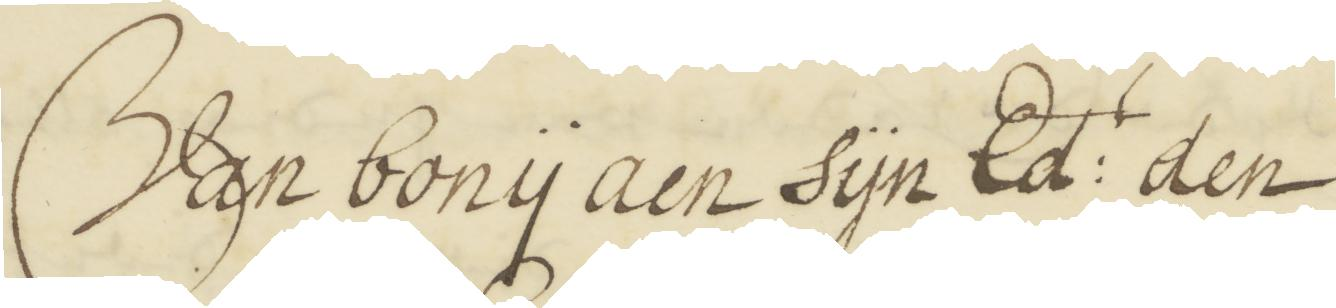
Van bonij aen sijn Ed:s den
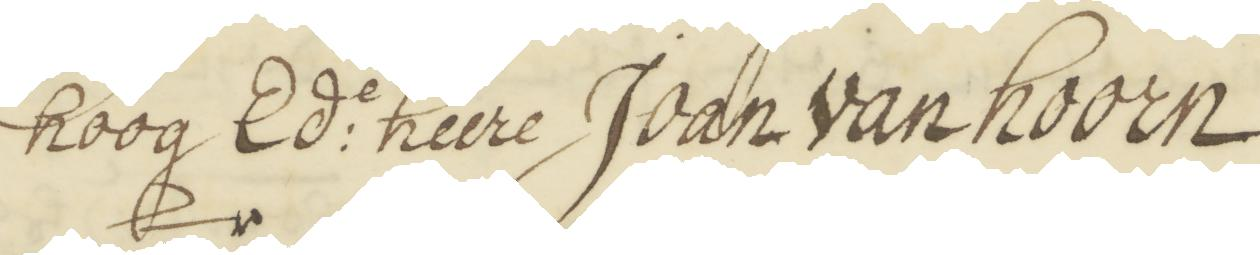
hoog Ed:e heere Joan van hoorn
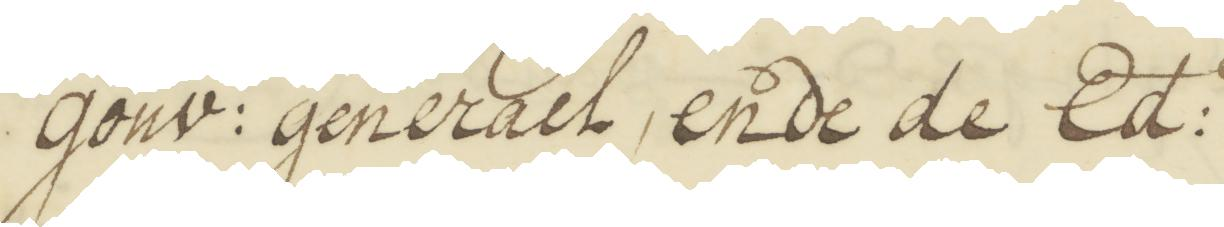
gouv:r generael, ende de Ed:e
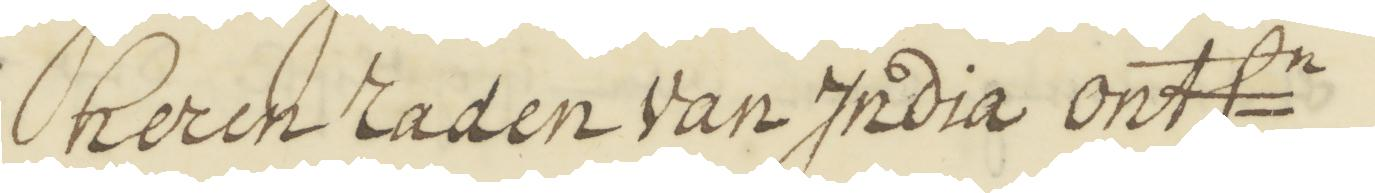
heren raden van Jndia ontf=n
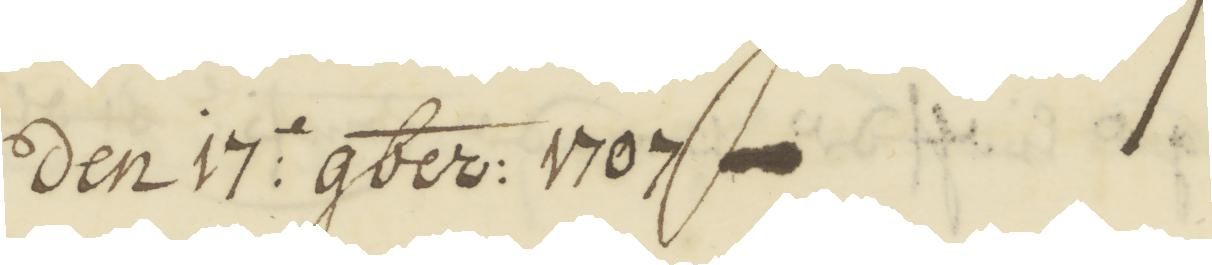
den 17:e 9ber: 1707 —
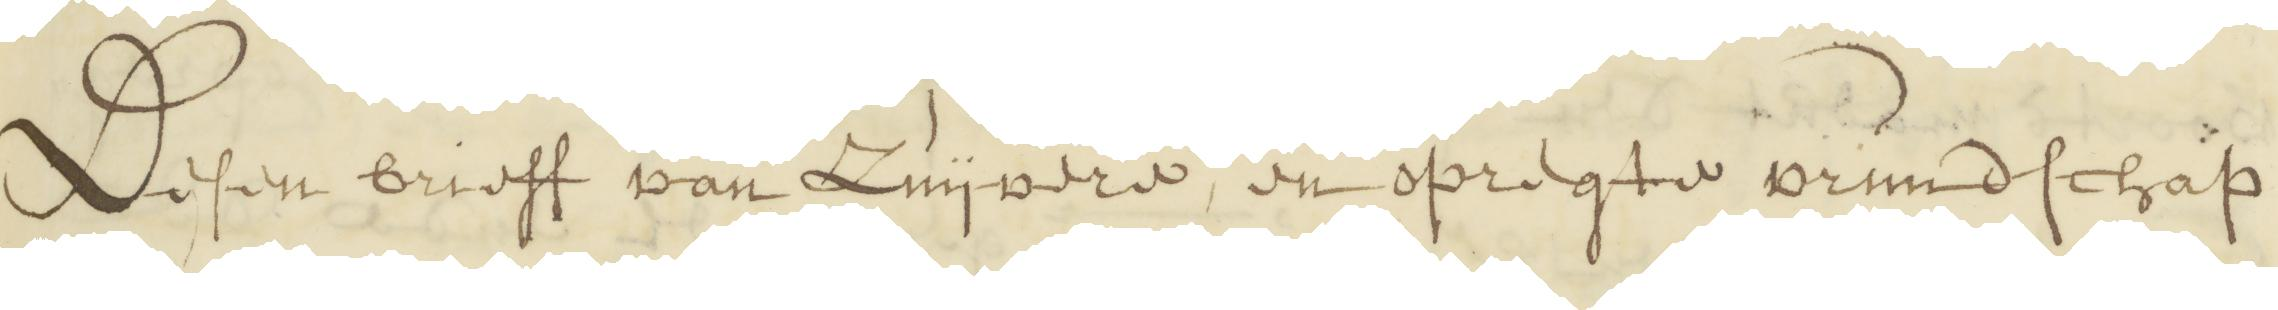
Desen brieff van zuijvere, en opregte vrundschap
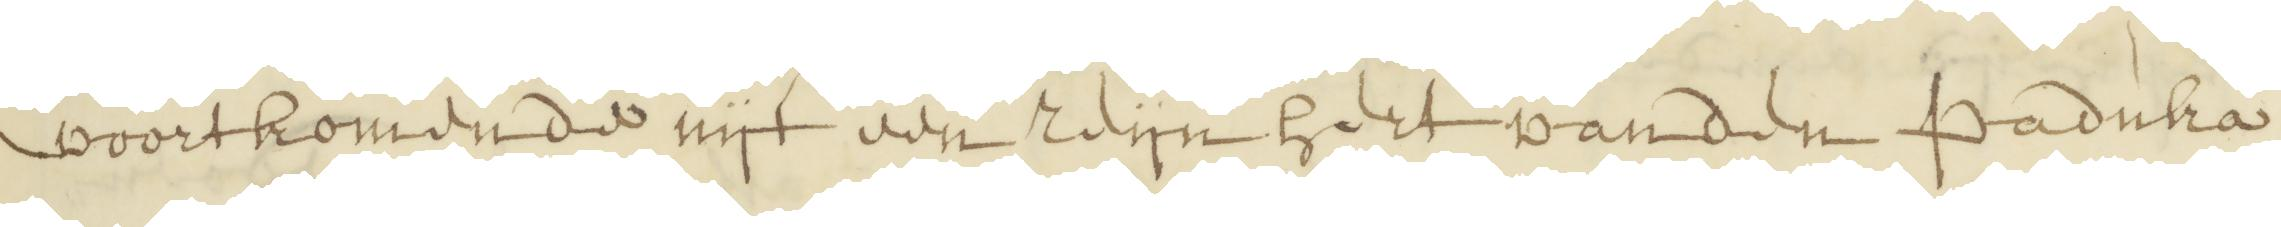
voortkomende uijt een reijn hert van den Paduka
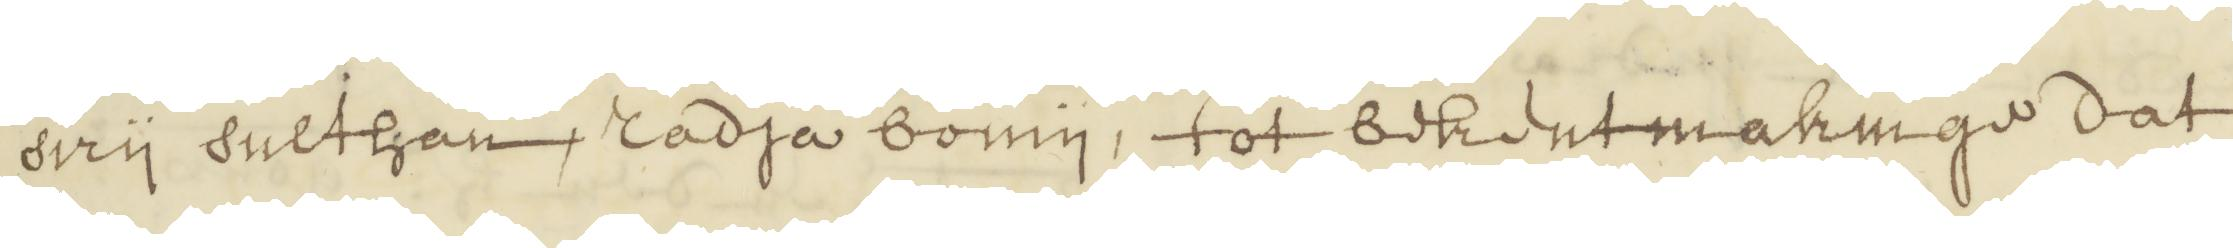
sirij sulthan, radja bomij, tot bekentmakinge dat
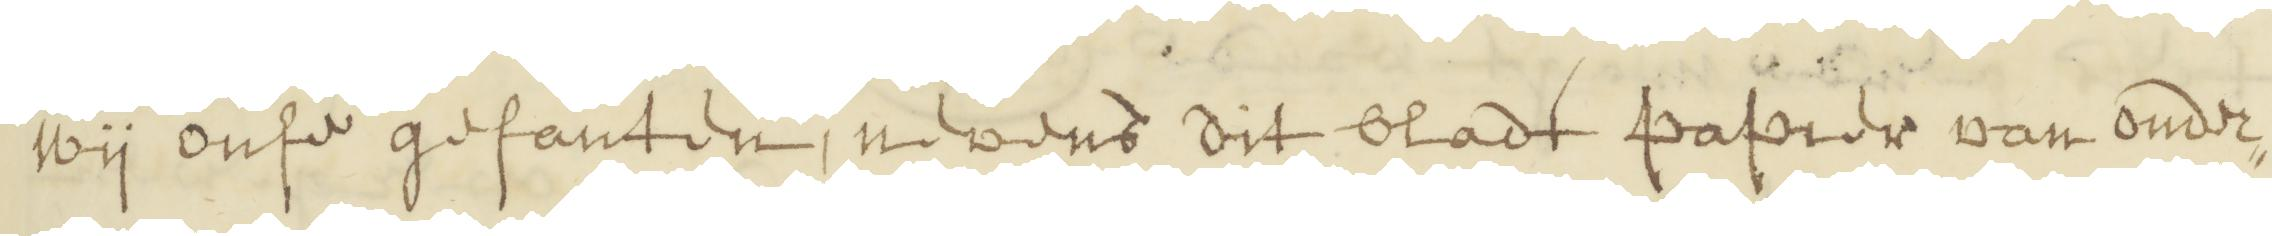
wij onse gesanten, nevens dit bladt papier van onder„
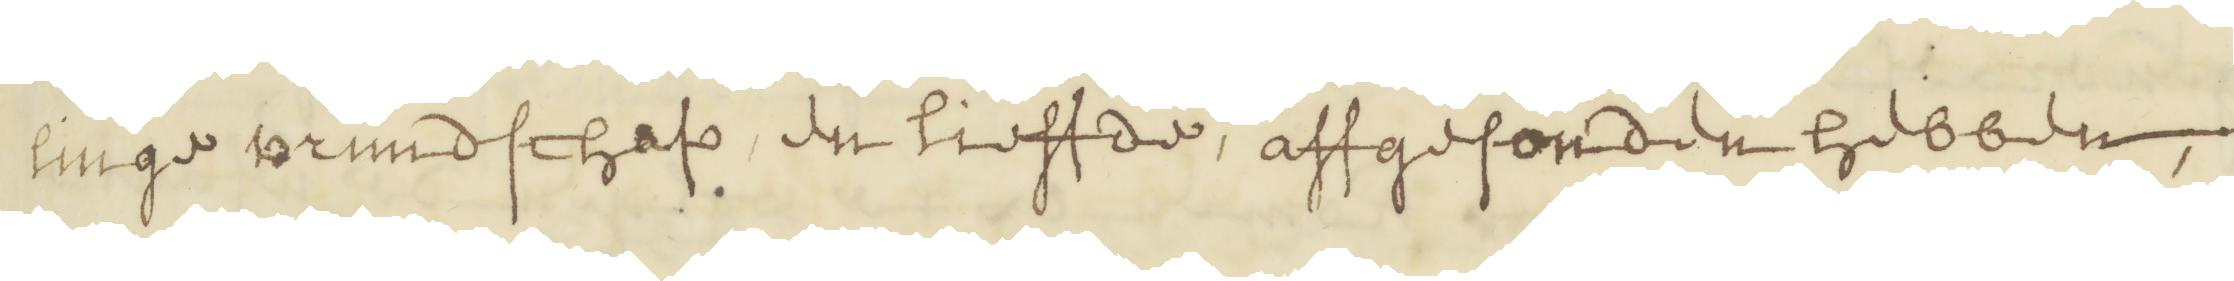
linge vrundschap, en lieffde, affgesonden hebben,
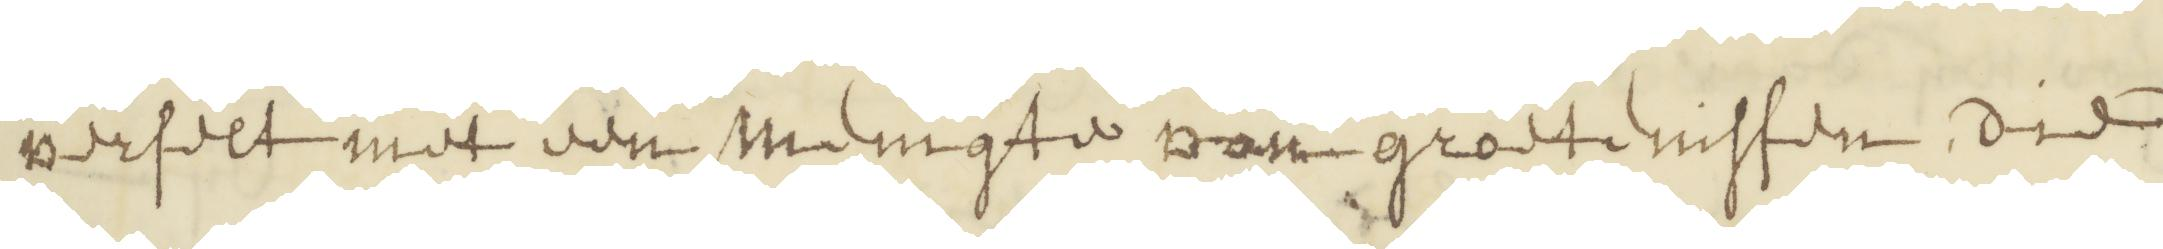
verselt met een menigte van groetenissen, die
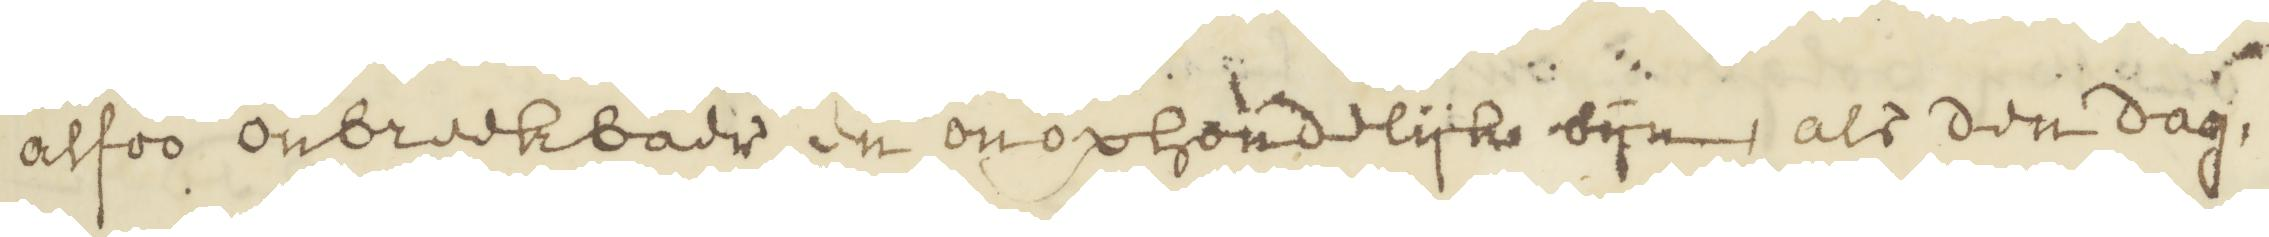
alsoo onbreekbaer en onophoudelijk sijn, als den dag,
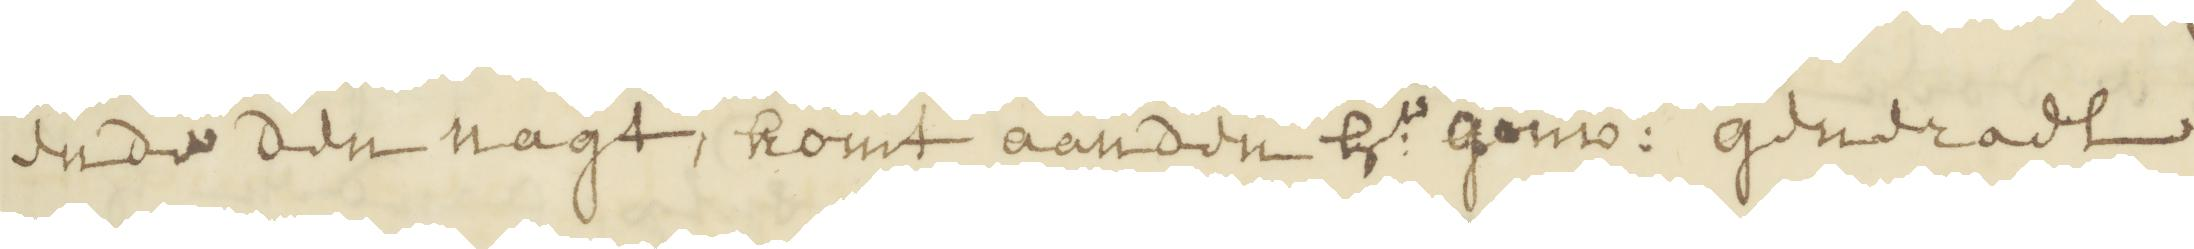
ende den nagt, komt aan den h:r gouv:r generael
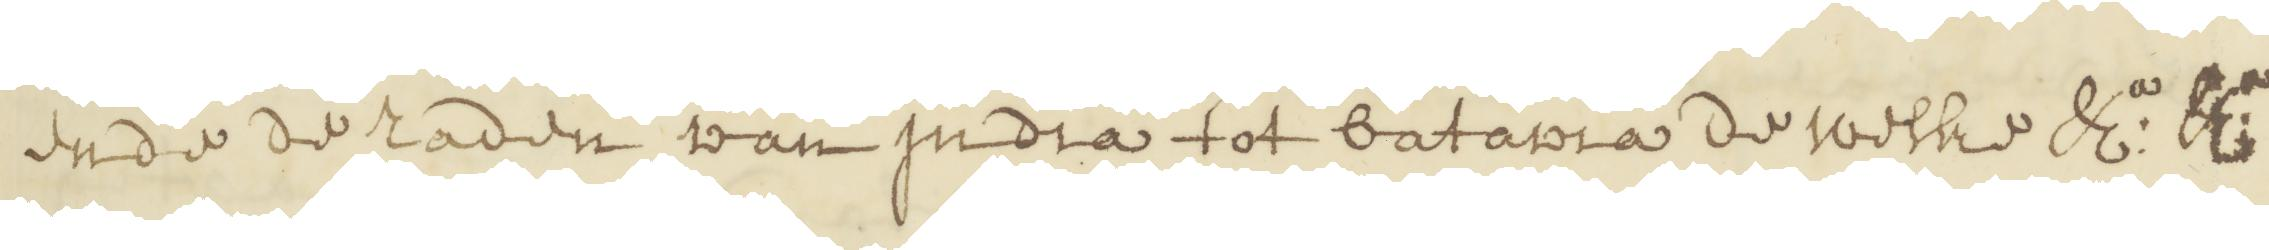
ende de raden van jndia tot batavia de welke &:a &:a
